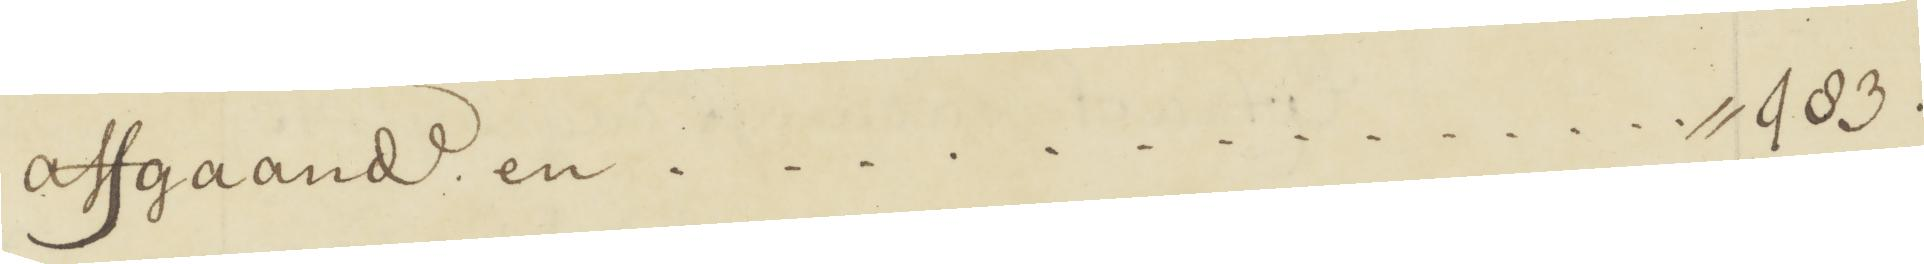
affgaande en.. . . . . . . . . . „483.
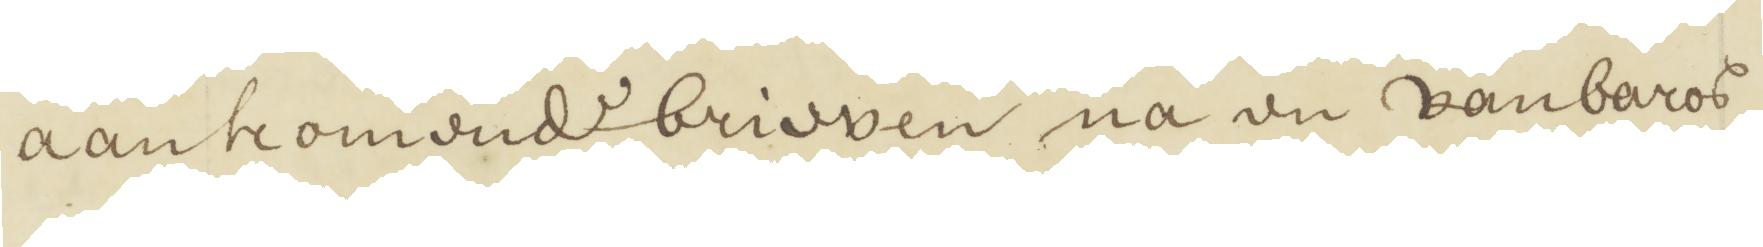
aan komende brieven na en van baros
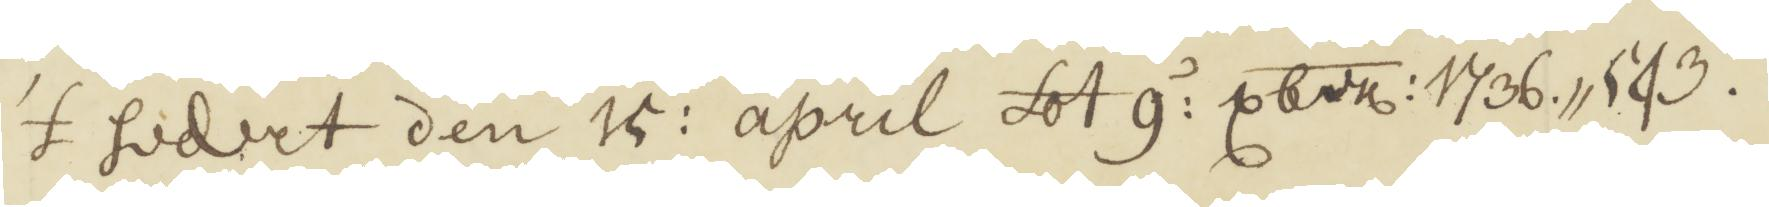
't sedert den 15:' april tot 9:' xber: 1736. „543.
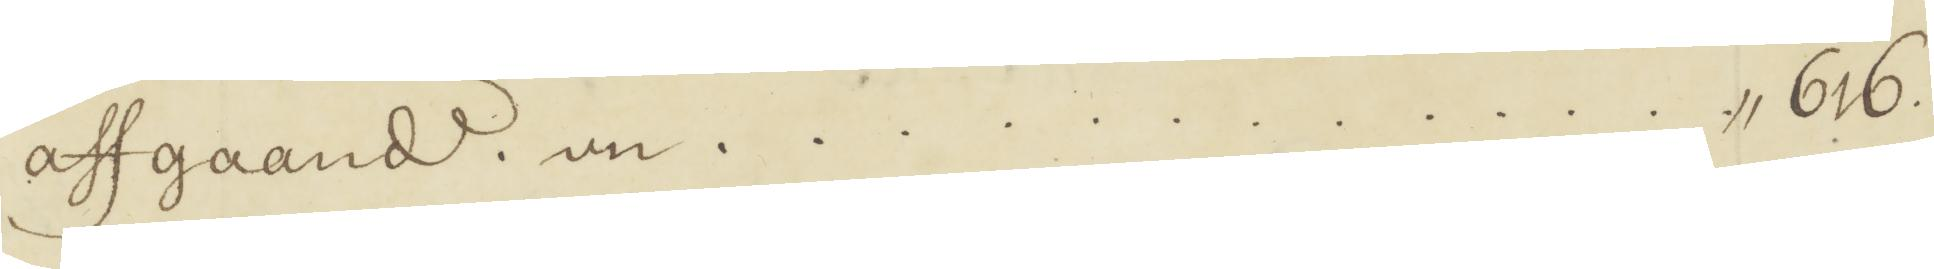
affgaande. en.. . . . . . . . . . . . „ 616.
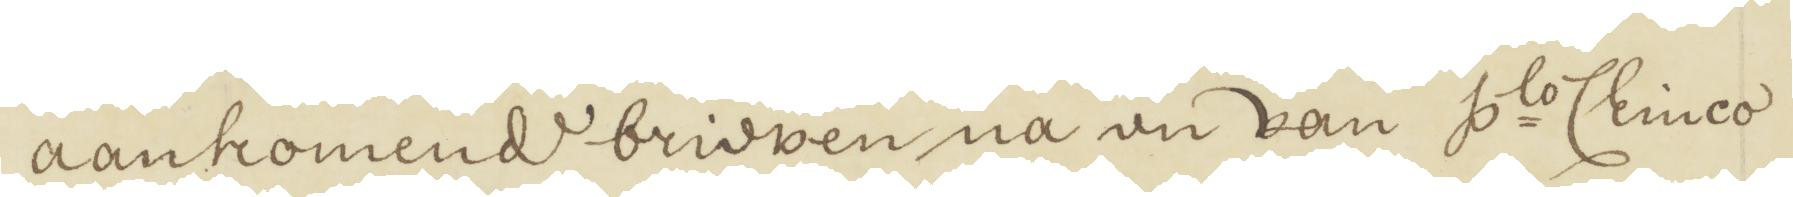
aankomende brieven na en van p=lo Chinco
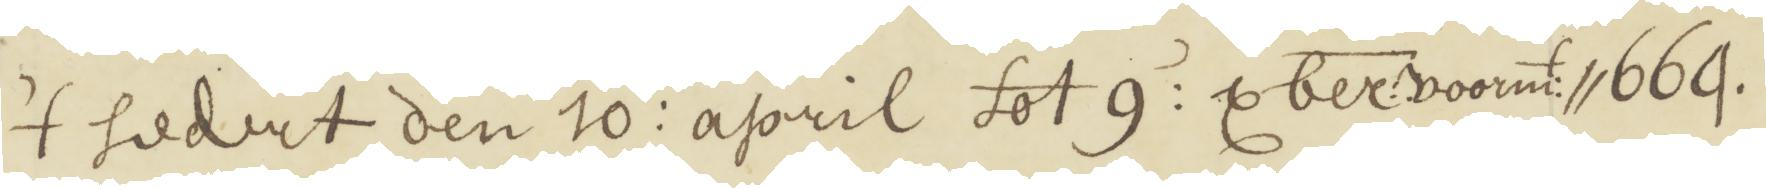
't sedert den 10:' april tot 9:' xber: voorm:t „664.
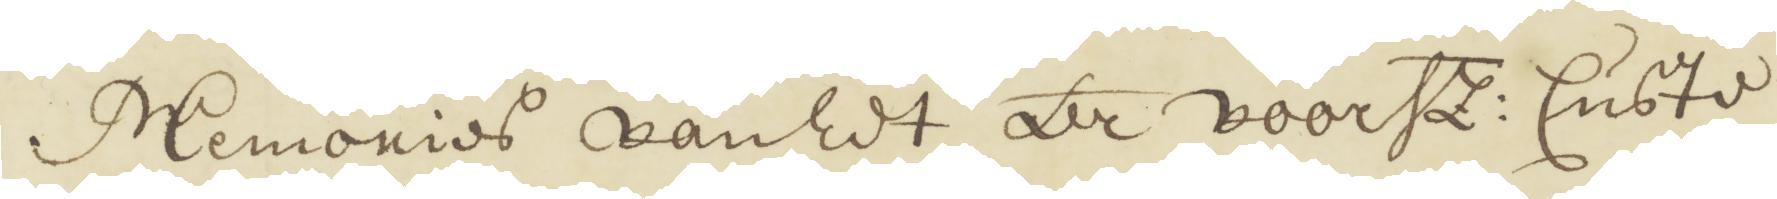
Memories van het ter voorsz: Custe
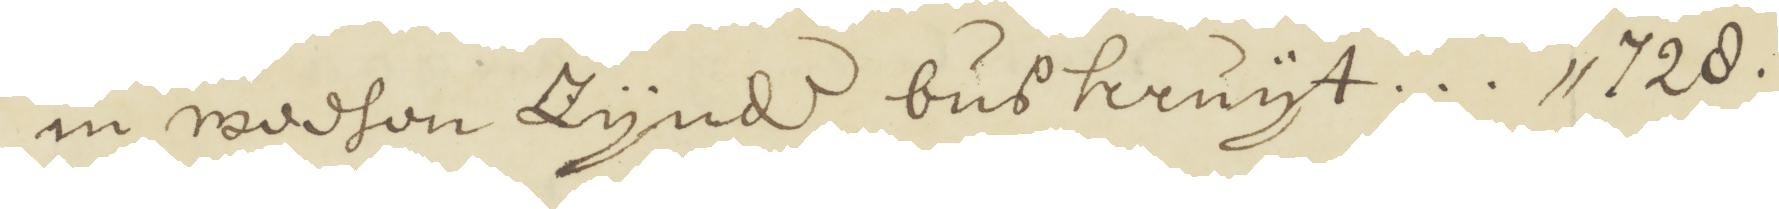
in weesen Zijnde buskruijt . . . „728.
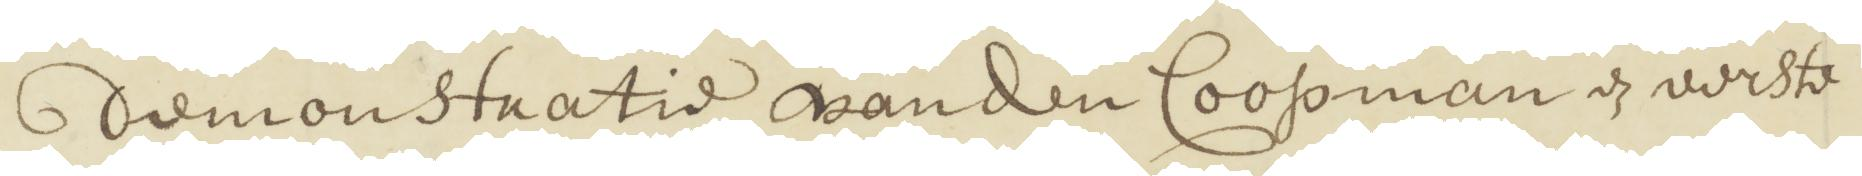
demonstratie van den Coopman en eerste
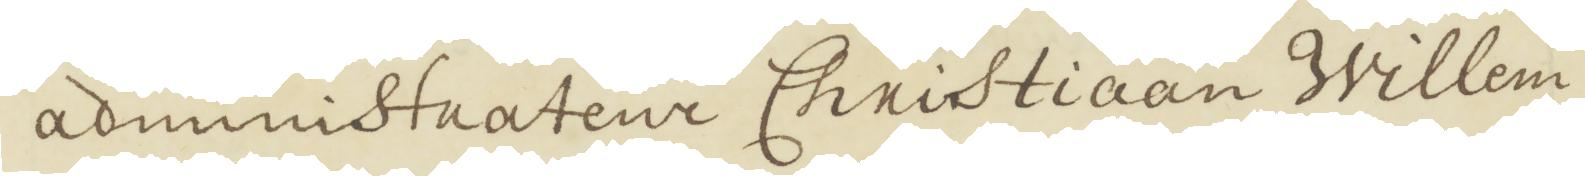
administrateur Christiaan Willem
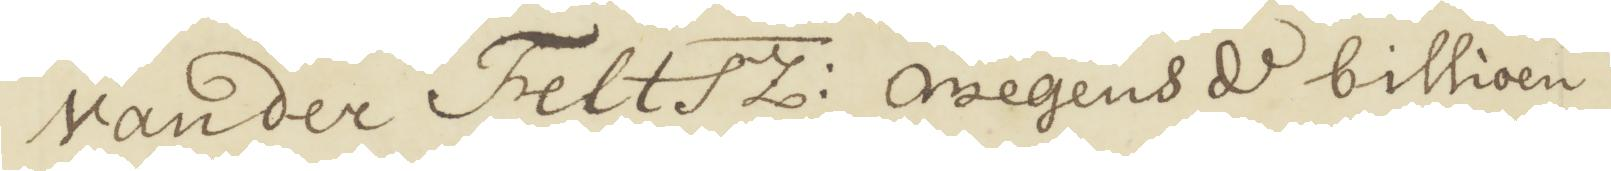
van der Feltsz: wegens de billioen
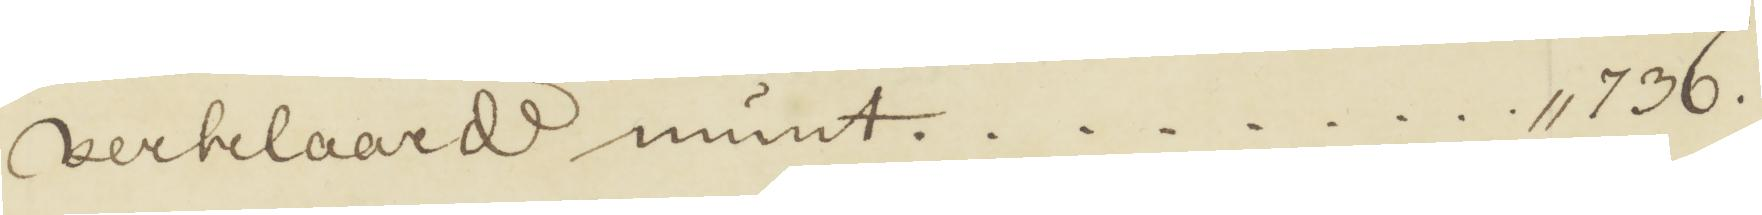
verklaarde munt.. . . . . . . . . „736.
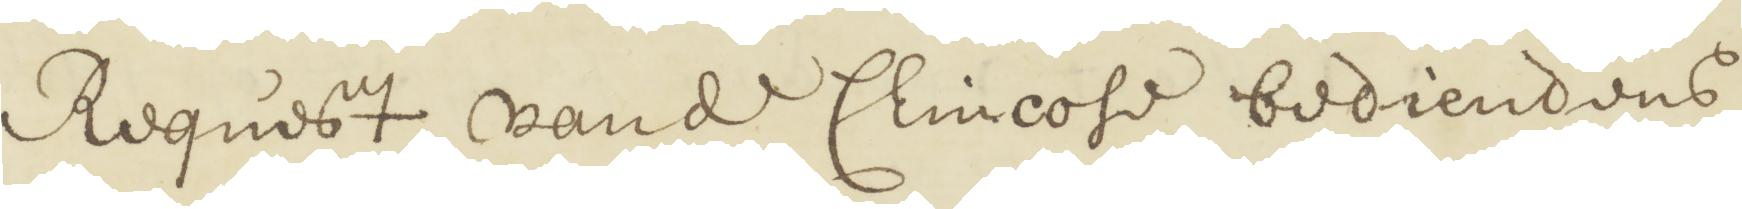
Request van de Chincose bediendens
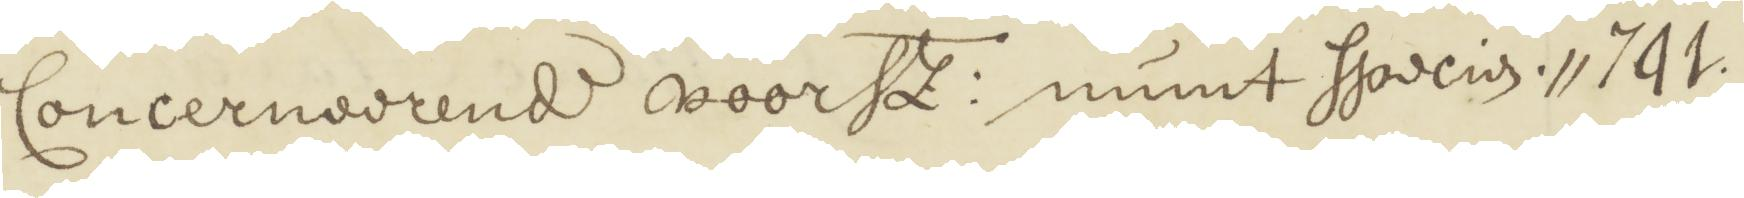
Concerneerende voorsz: munt specien. „741.
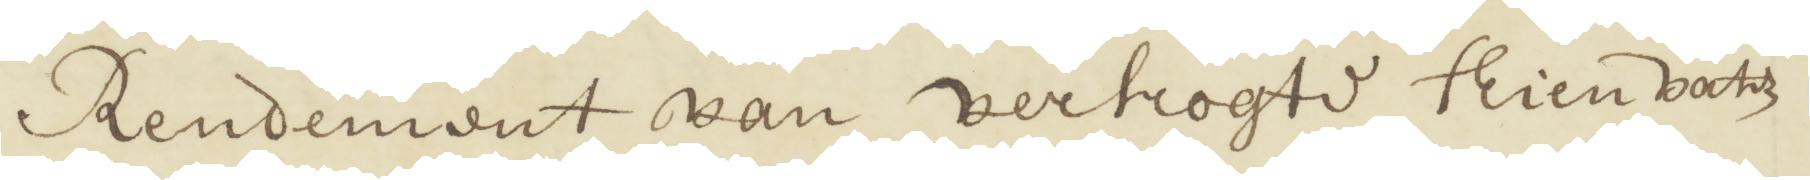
Rendement van verkogte thien vaten
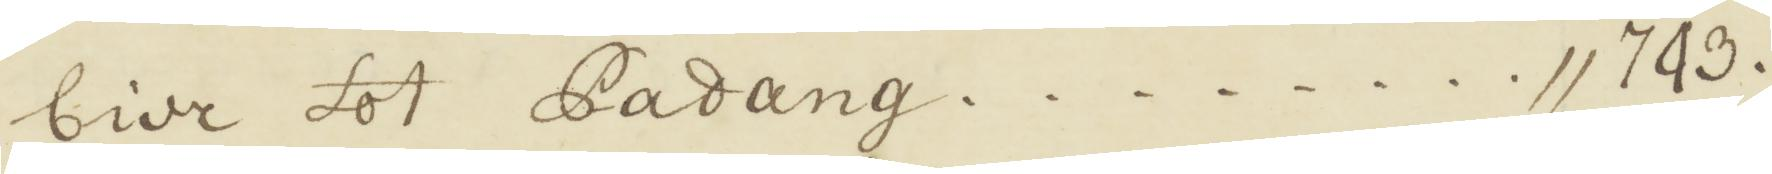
bier tot Padang. „743.
